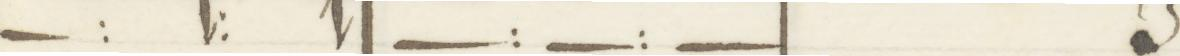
—: 1: 1 —:—:— 3
